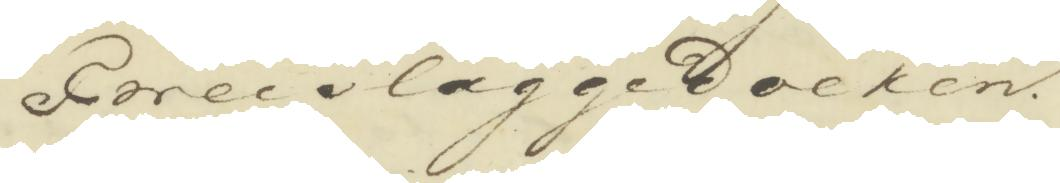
Twee vlaggedoeken.
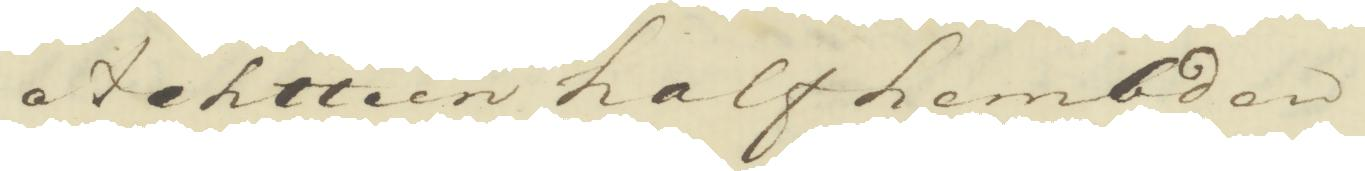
Achttien half hembden
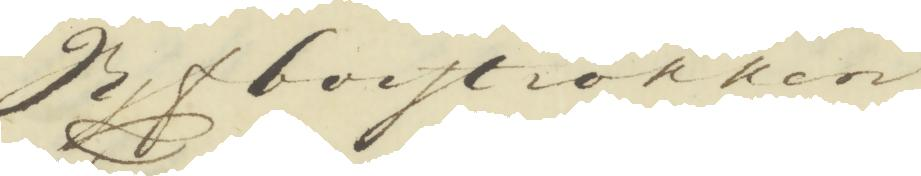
Vyf borstrokken
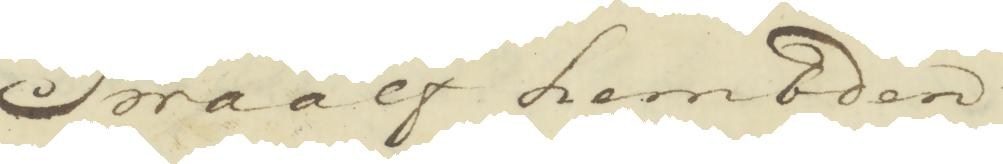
Twaalf hembden
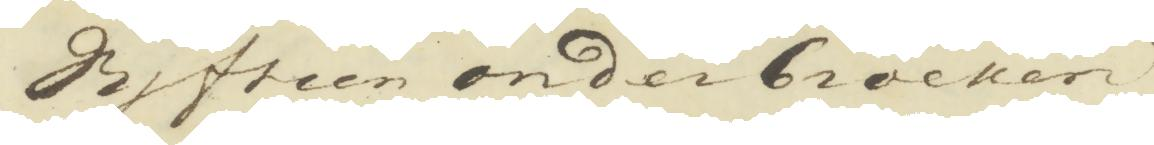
Vyftien onder broeken
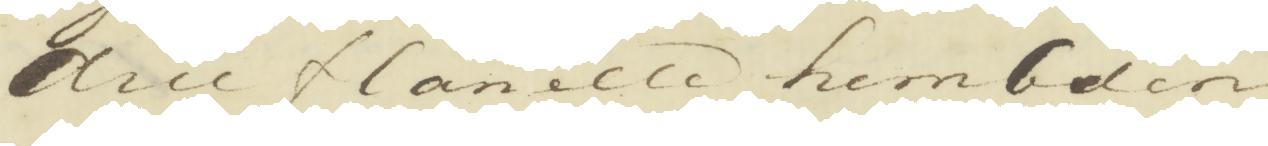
drie flanèlle hembden
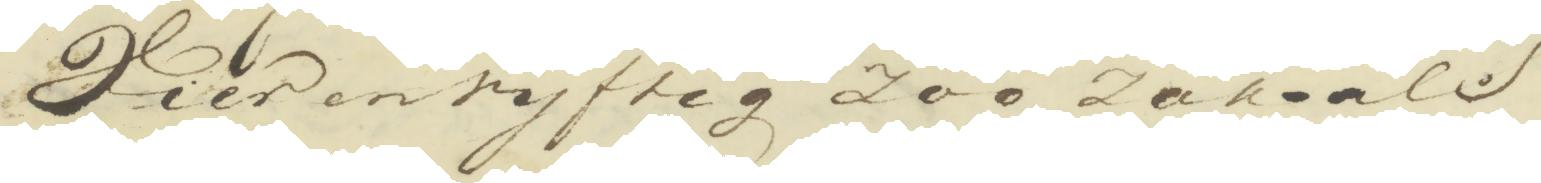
Vier en vyftig zoo zake als
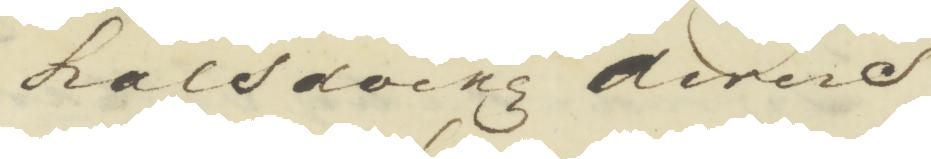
halsdoeke divers
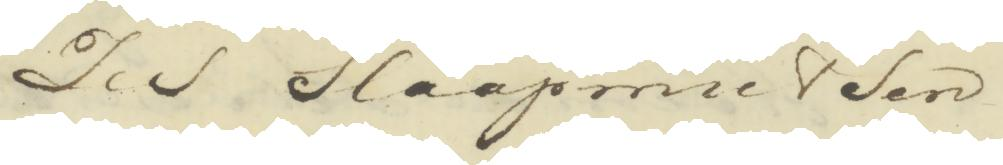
Zes slaap mutsen
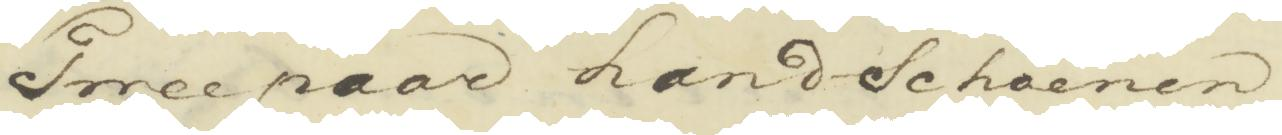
Twee paar handschoenen
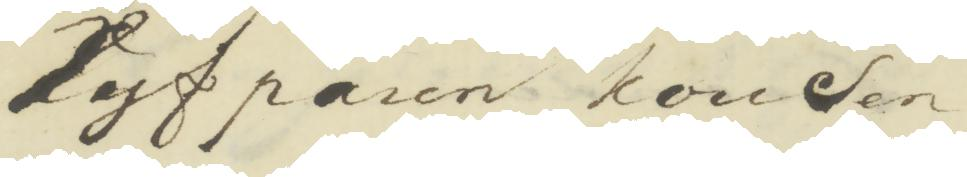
Vyf paren kousen
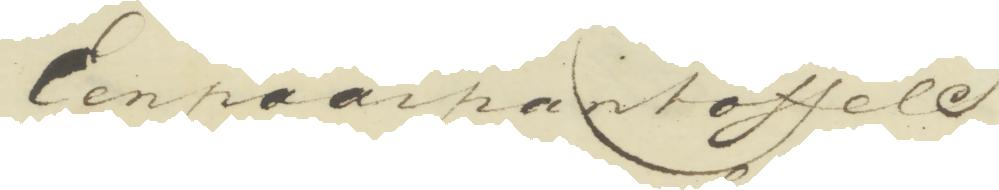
Een paar pantoffels
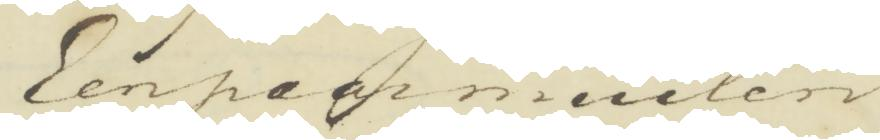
Een paar muilen
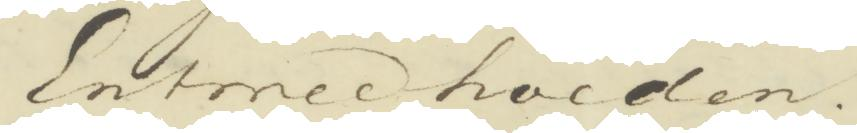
En twee hoeden.
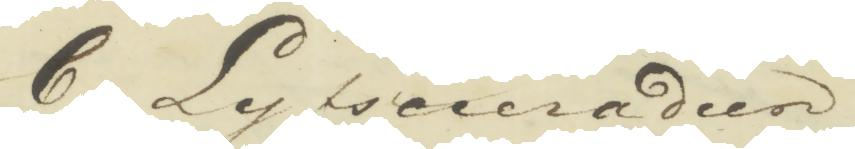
B. Lyfscieradeen
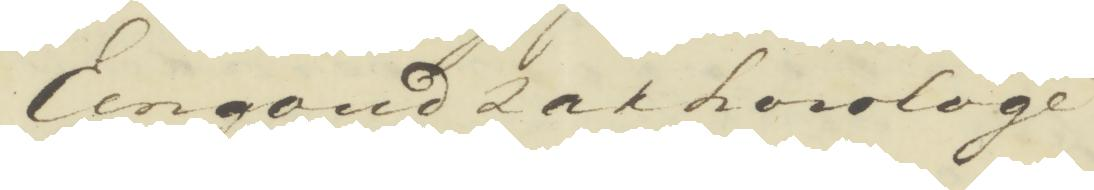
Een goud zak horologe
